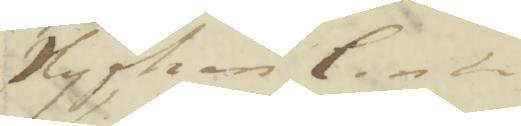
Vyftien Cents
